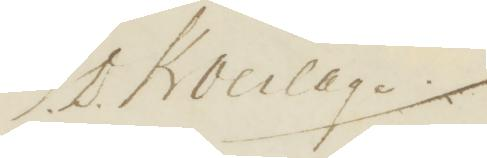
G. D. Boerlage ./.
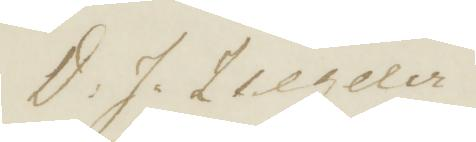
D: J. Ziegeler
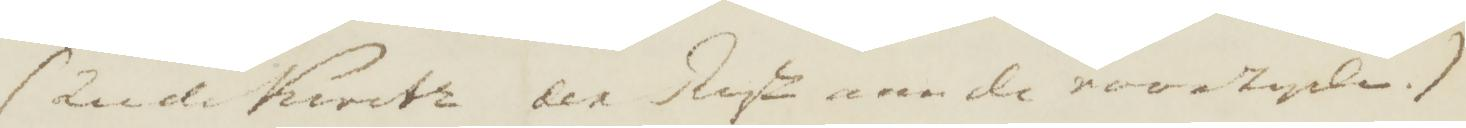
(Zie de Keriten der Regten aan de voorzyde.)
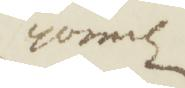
Cromel
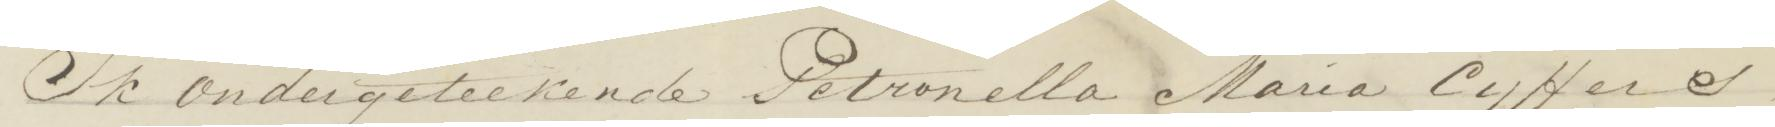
Ik ondergeteekende Petronella Maria Cyffers
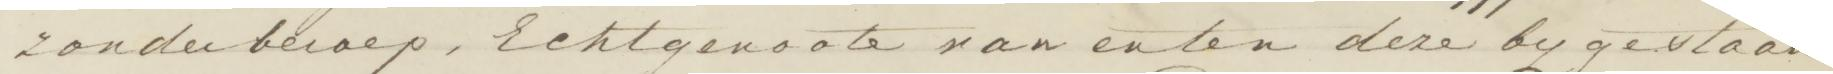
zonder beroep, Echtgenoote van en ten deze by gestaan
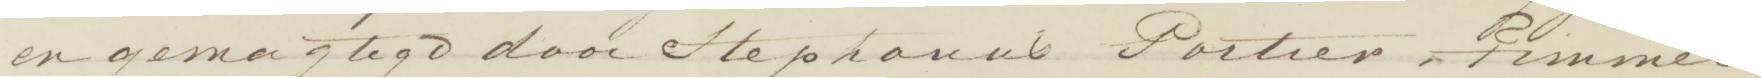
en gemagtigd door Stephanus Portier, Timmer
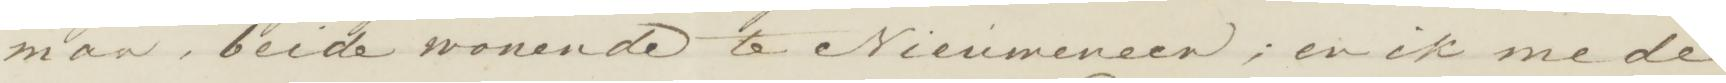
man, beide wonende te Nieuweveen; en ik mede
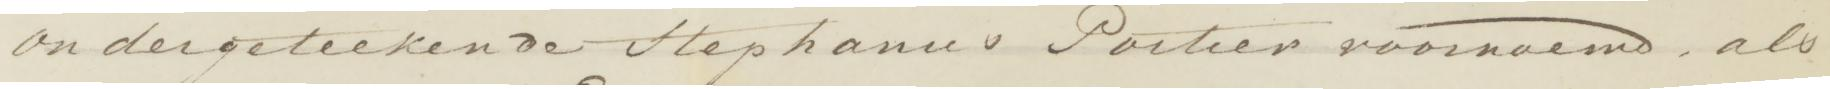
ondergeteekende Stephanus Portier voornoemd, als
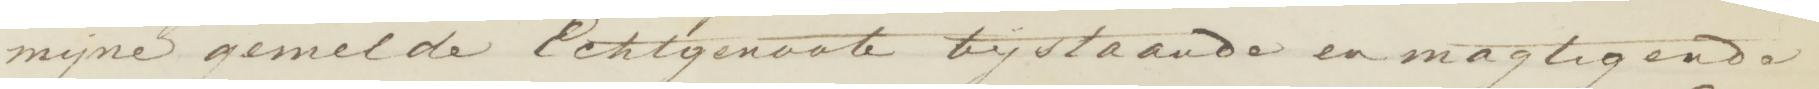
mijne gemelde Echtgenoote bijstaande en magtigende
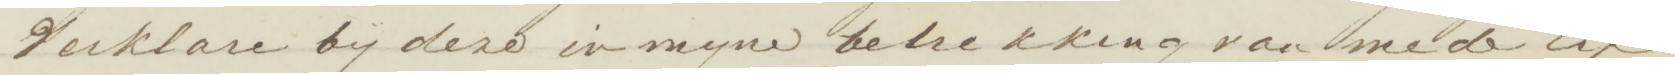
Verklare bij deze in myne betrekking van mede Erf
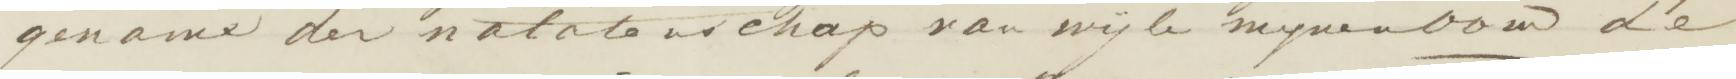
gename der nalatenschap van wijle mynen oom de
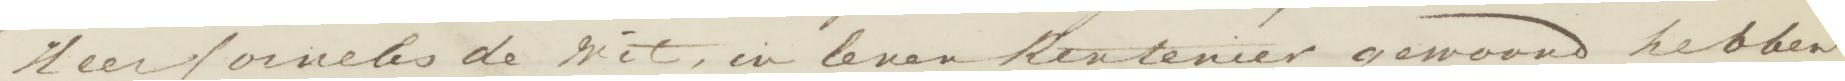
Heer Cornelis de Wit, in leven Rentenier gewoond hebben
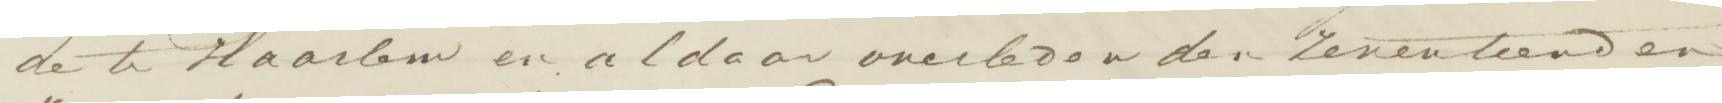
de te Haarlem en, aldaar overleden den zeventienden
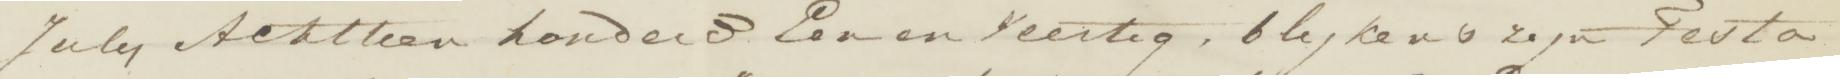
July Achttien honderd. Een en Veertig, blijkens zyn Testa
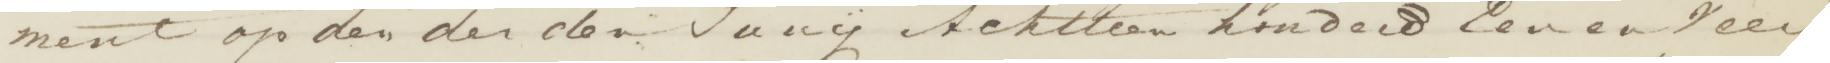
ment op den der den Iunij Achttien honderd Een en Veer
